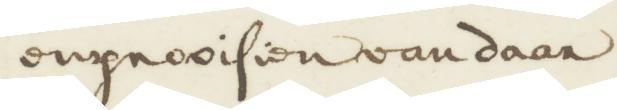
en provisien van daar
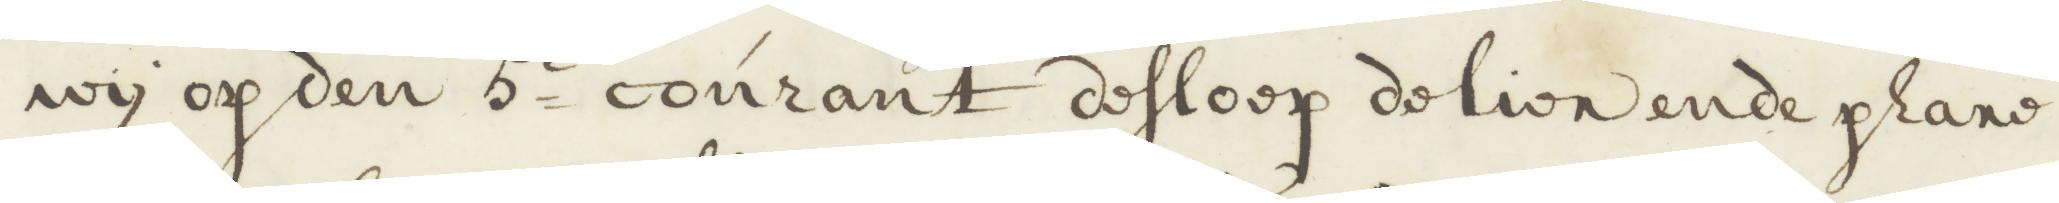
wij op den 5=e courant desloep de lier ende phare
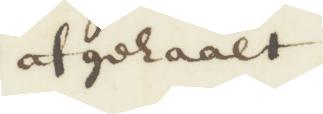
afgehaalt
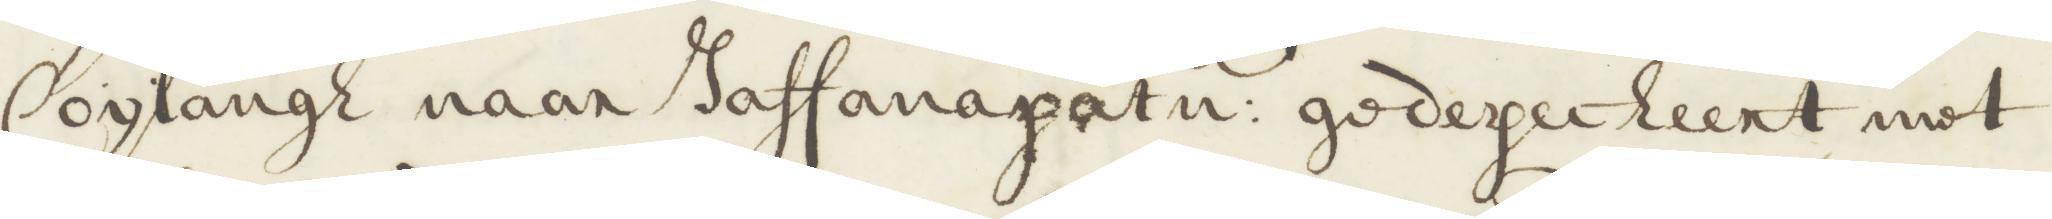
Coijlangh naar Jaffanapatn: gedepecheert, met
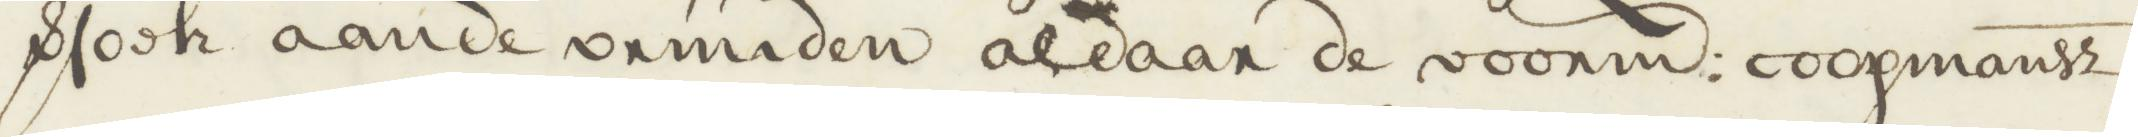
versoek aan de vrunden aldaar de voorm: coopmansz
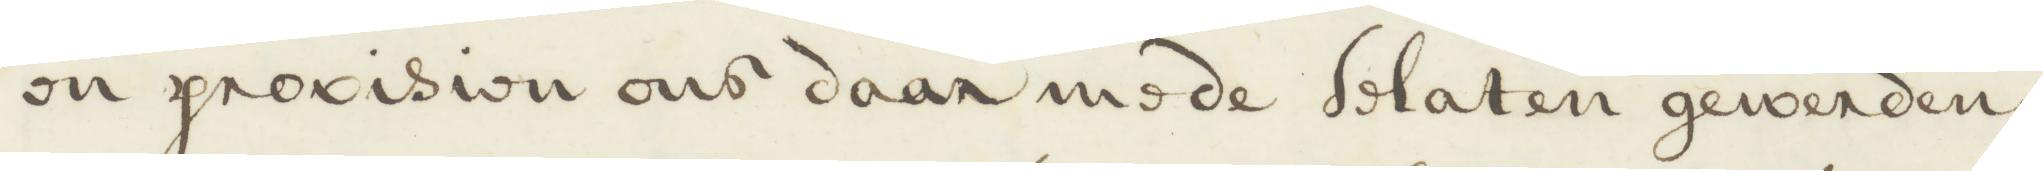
en provisien ons daar mede telaten gewerden
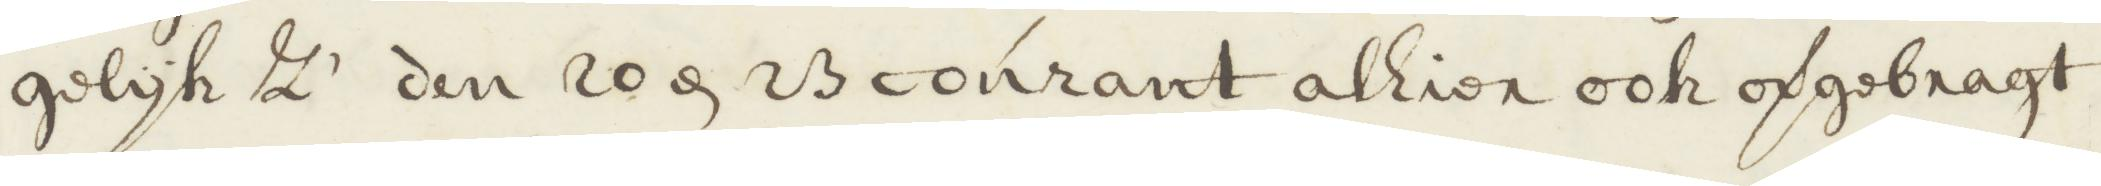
gelijk z' den 20 en 23 courant alhier ook overgebragt
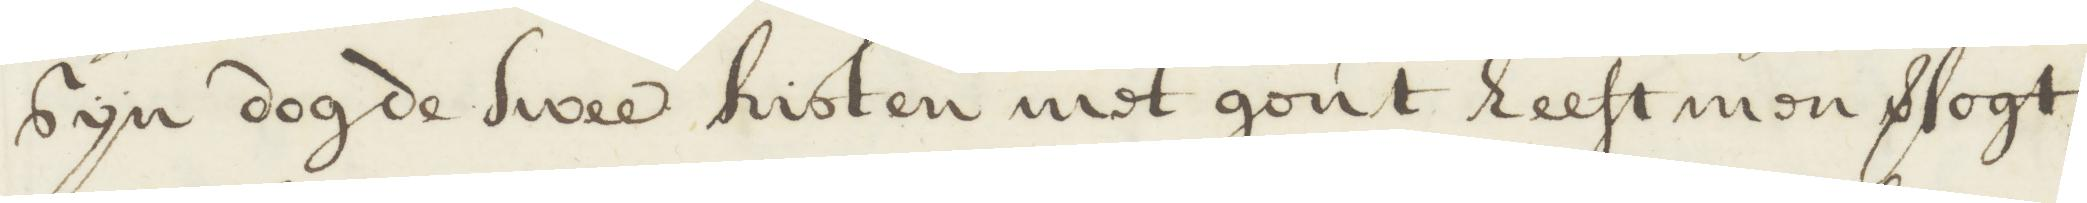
sijn dog de twee kisten met gout heeft men versogt
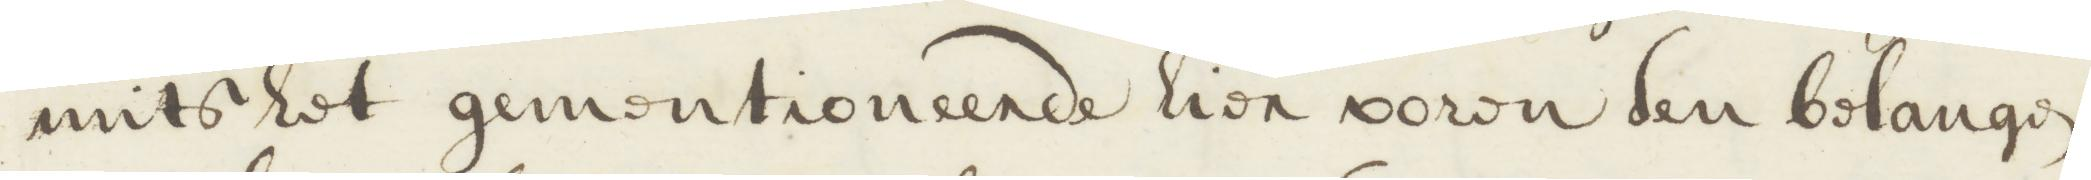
mits het gementioneerde hier voren ten belangen
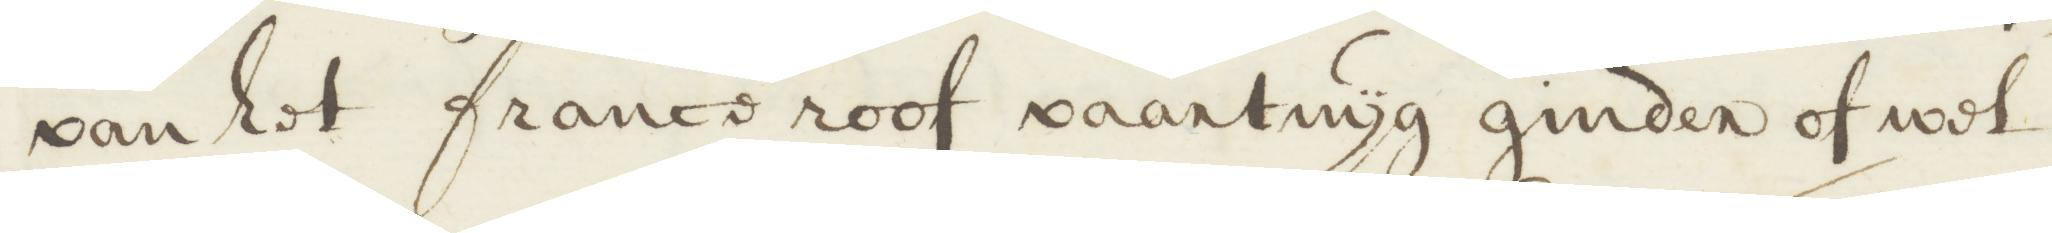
van het france roof vaartuijg ginder of wel
